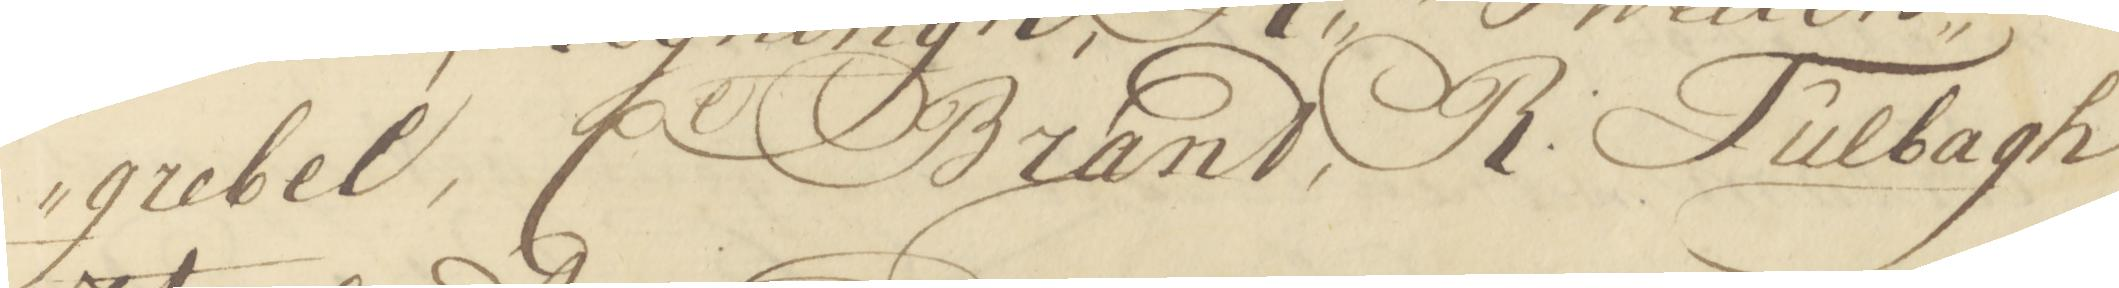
„grebel Cl Brand, R : Tulbagh
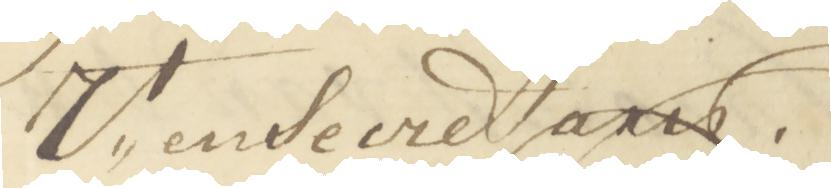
r„t en secretaris.
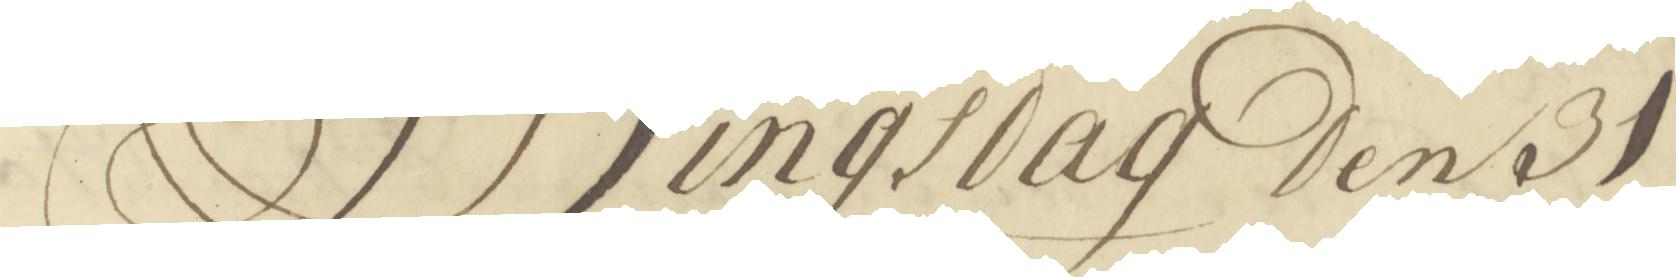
Dingsdag den 31
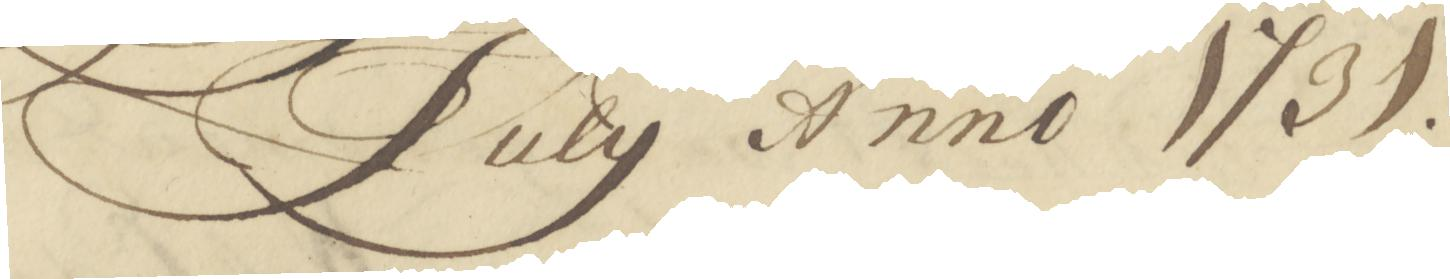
Julij Anno 1731.
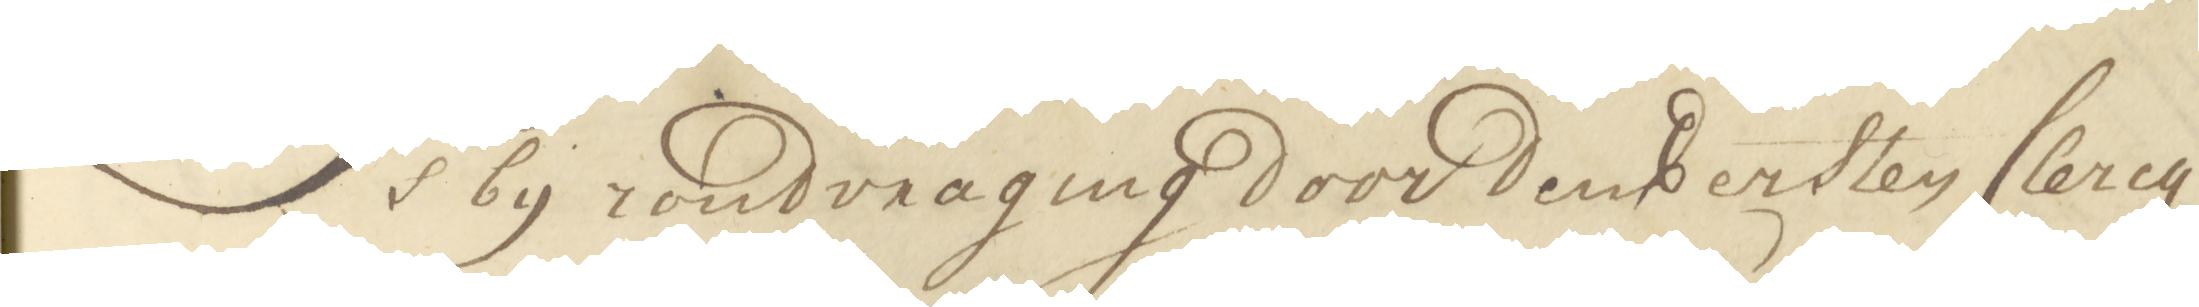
Is bij rondvraging door den Eersten Clercq
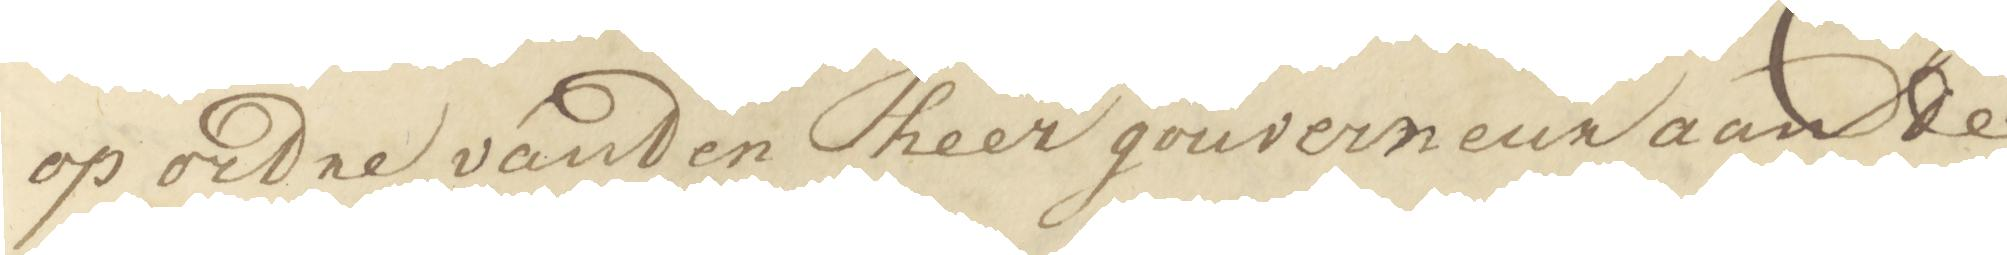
op ordre van den heer gouverneur aan de
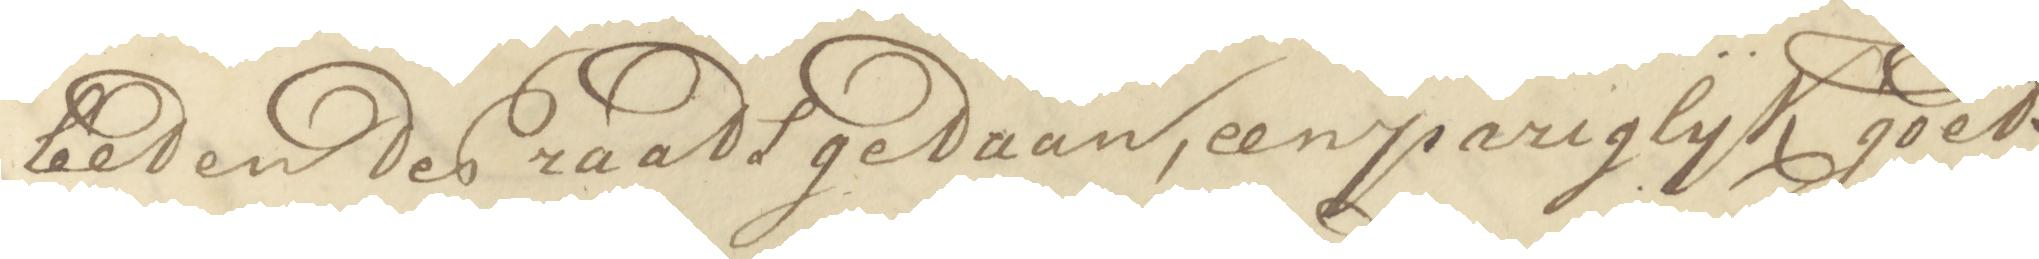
leeden des raads gedaan, eenpariglijk goed
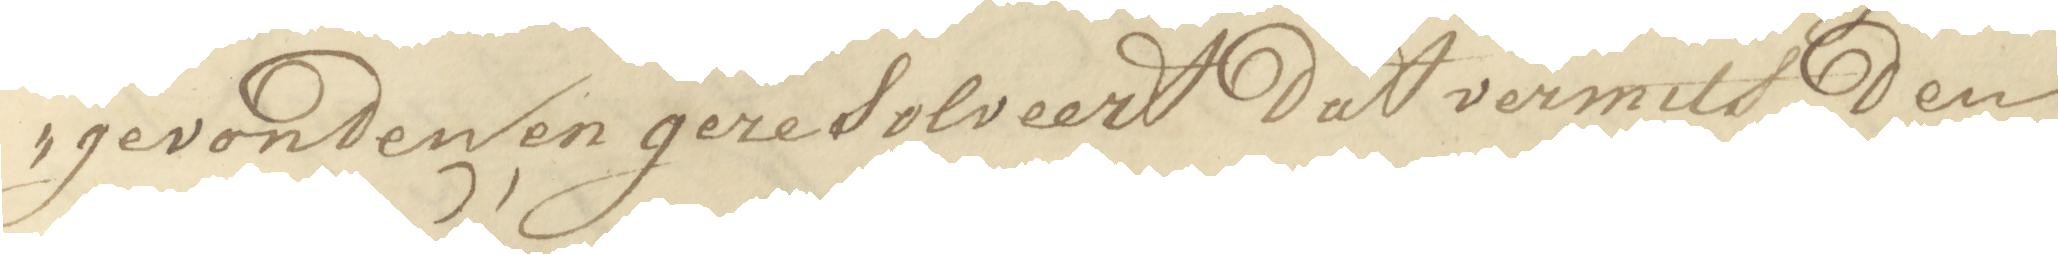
„gevonden en geresolveert dat vermits den
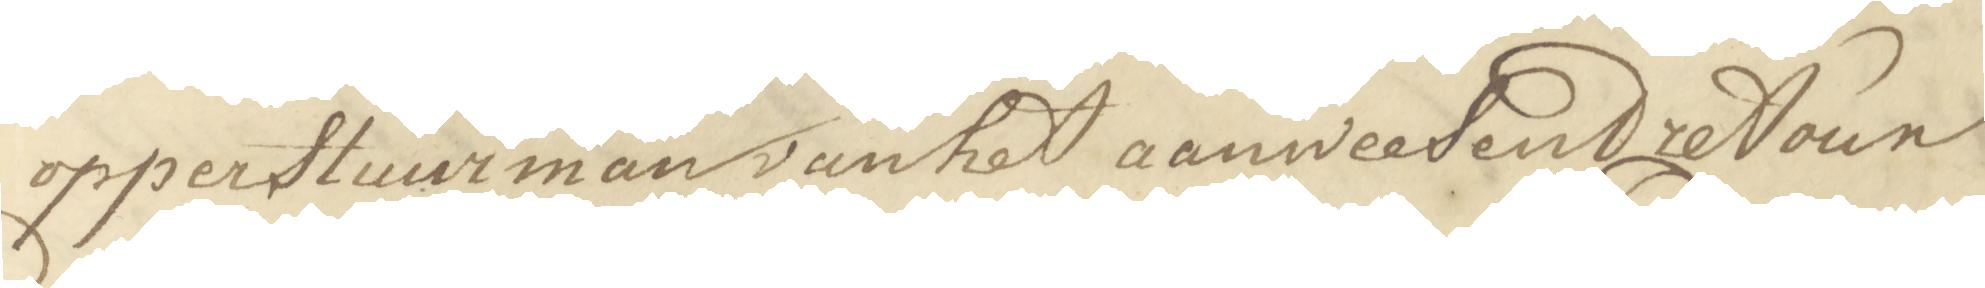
opperstuurman van het aanweesend retour
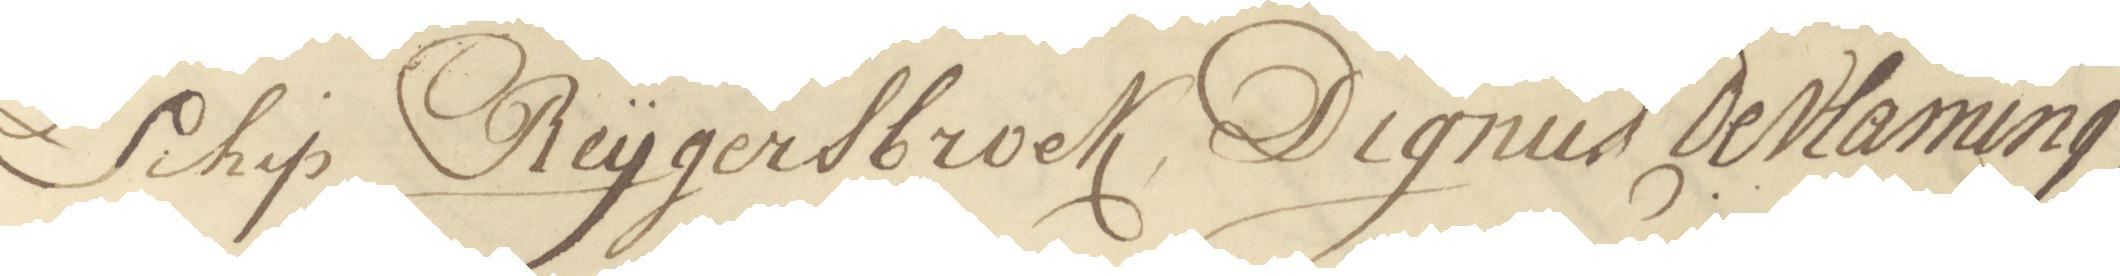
schip Reijgersbroek, Dignus devlaming
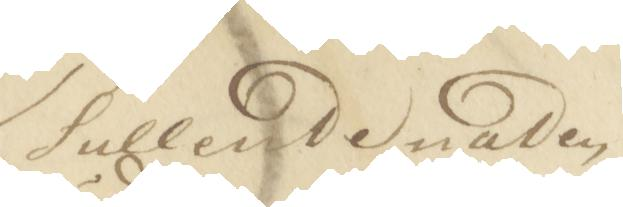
sullende naden
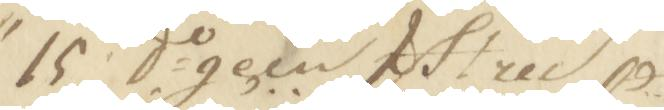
15:' d=o geen verstrec„
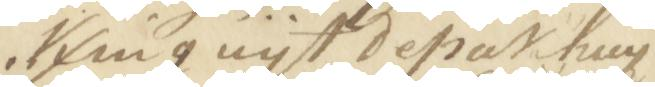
„king uijt de pakhuij
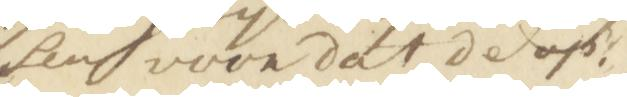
sen voor dat de op,
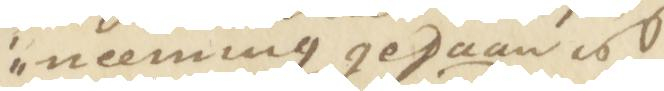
„neeming gedaan is
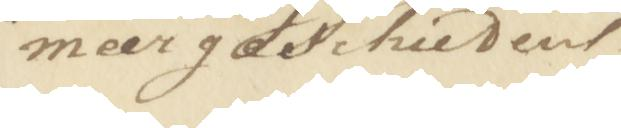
meer geschieden
